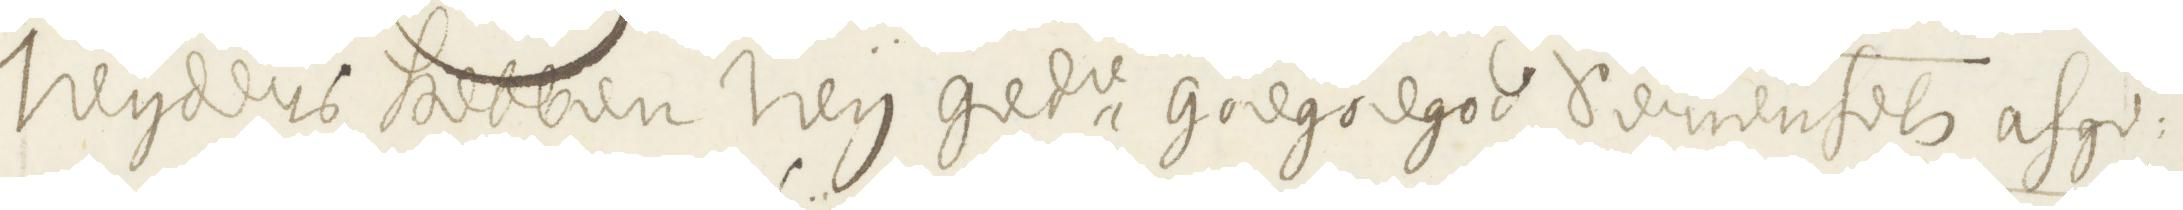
Wijders hebben Wij ged„e goegoegoe Serieusels afge„
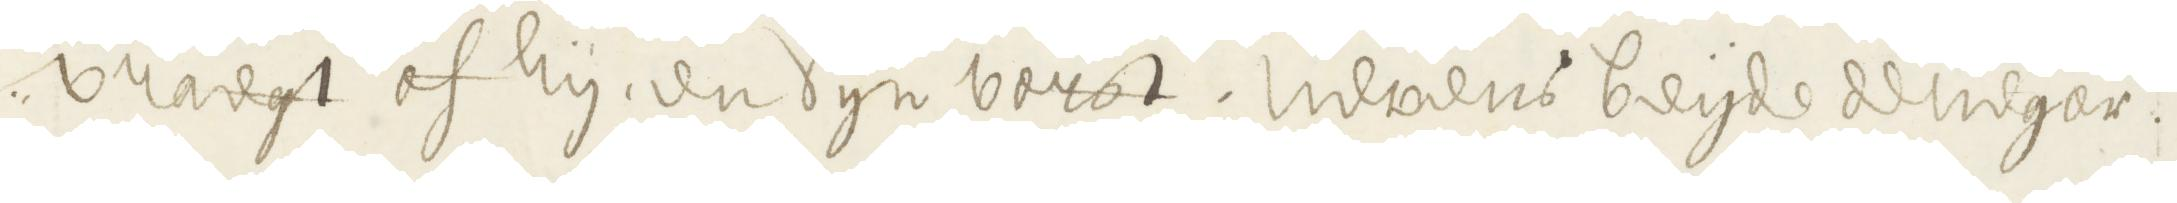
„vraegt of hij, en Sijn vorst. nevens beijde de neger:
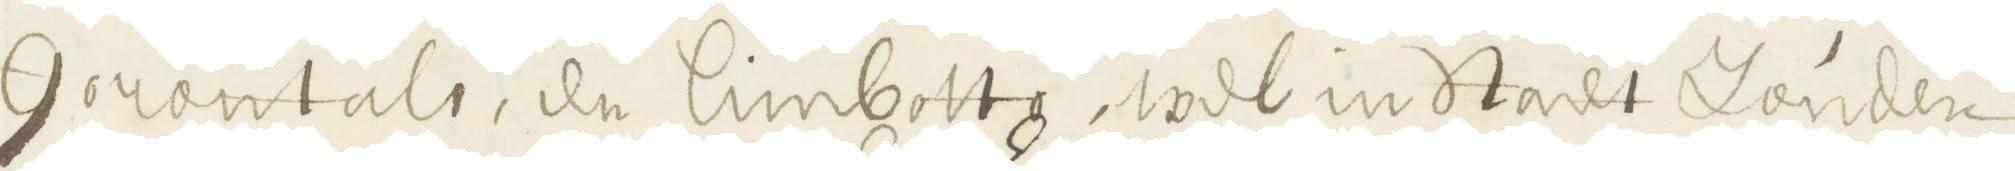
Gorontali en limbotto, wel in staet Zouden
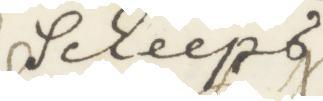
scheeps
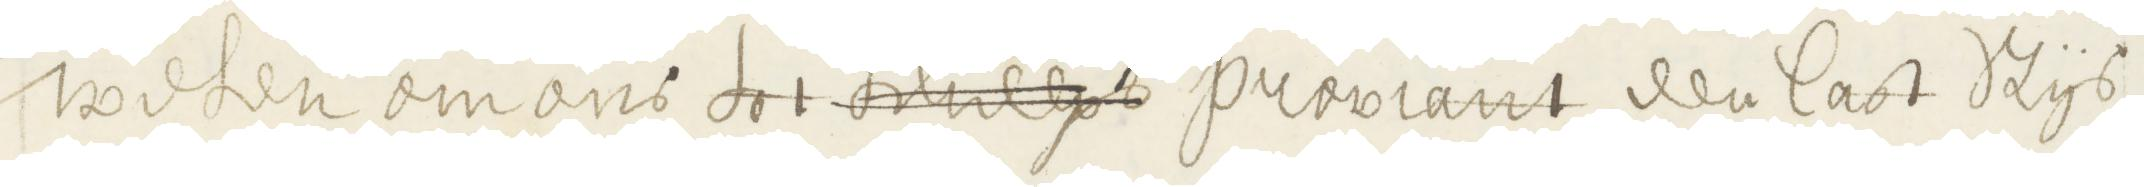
wesen om ons tot scheeps proviant een last Rijs
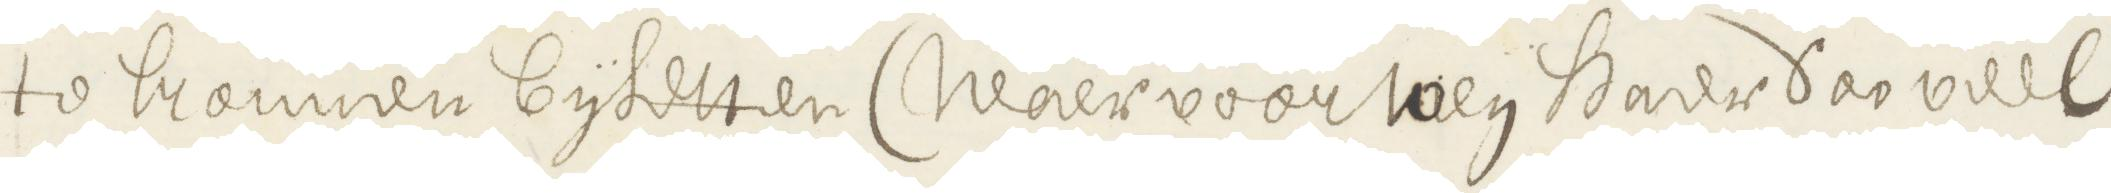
te konnen bij setten (waer voor wij haer soo veel
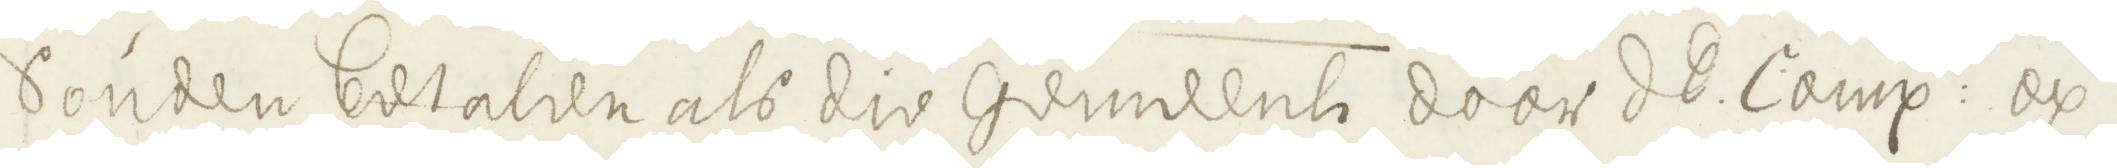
souden betalen als die gemeenlijk door d E. Comp: op
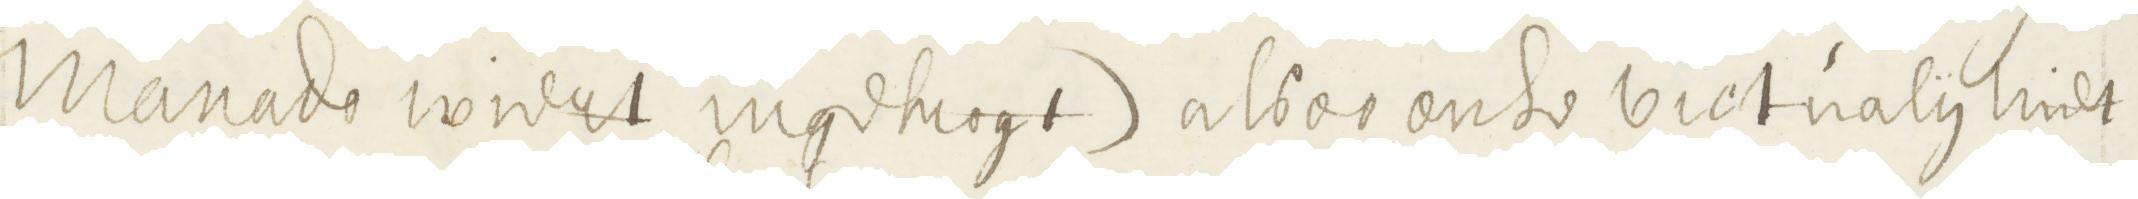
Manado wiert ingekogt) alsoo onse victualij niet
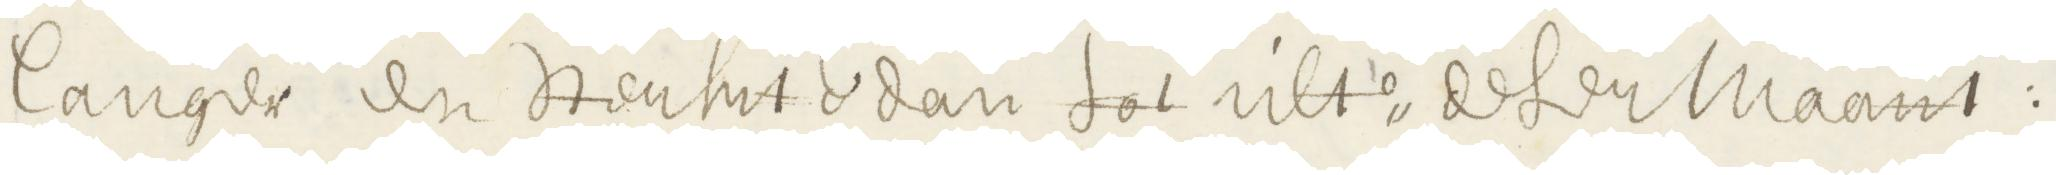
langer en sterkte dan tot ult„o deser Maant:
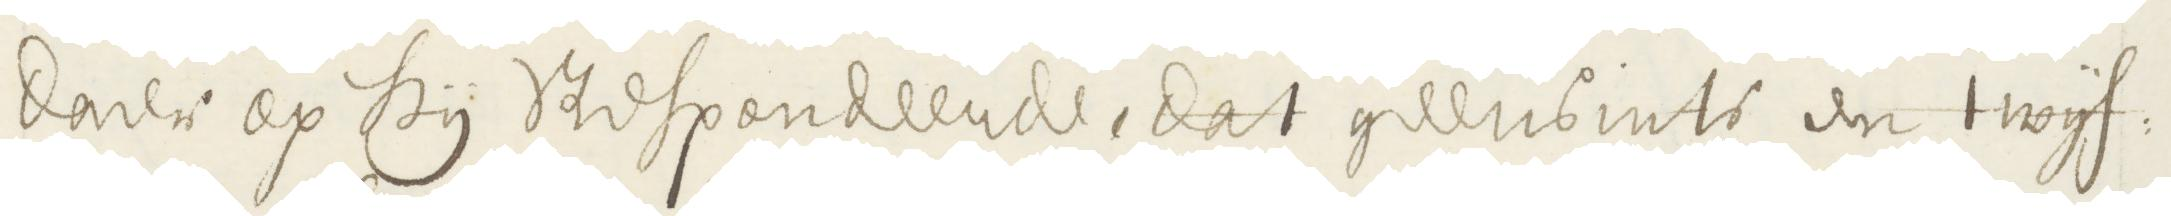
daer op hij Respondeerde, dat geensints en twijf„
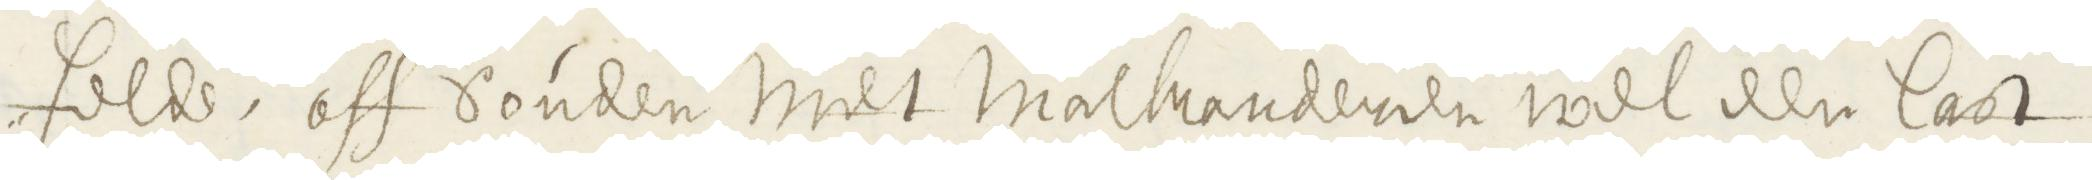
felde, off Souden met Malkanderen wel een last
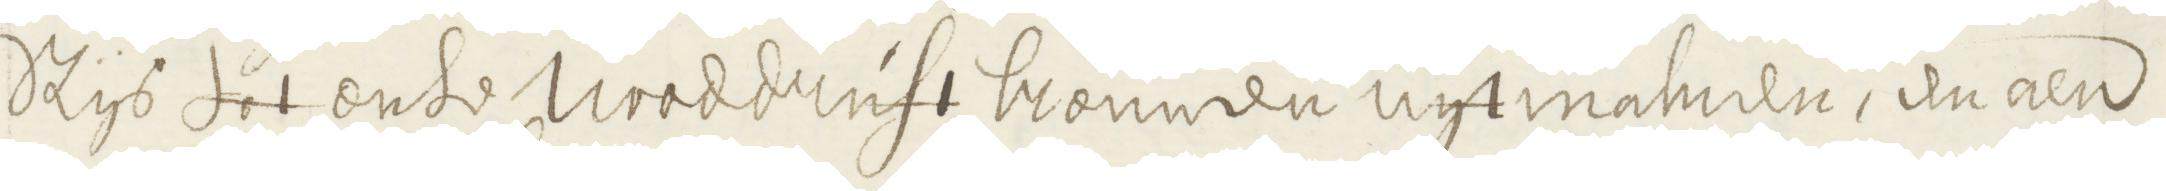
Rijs tot onse nooddruft konnen uijtmaken, en aen
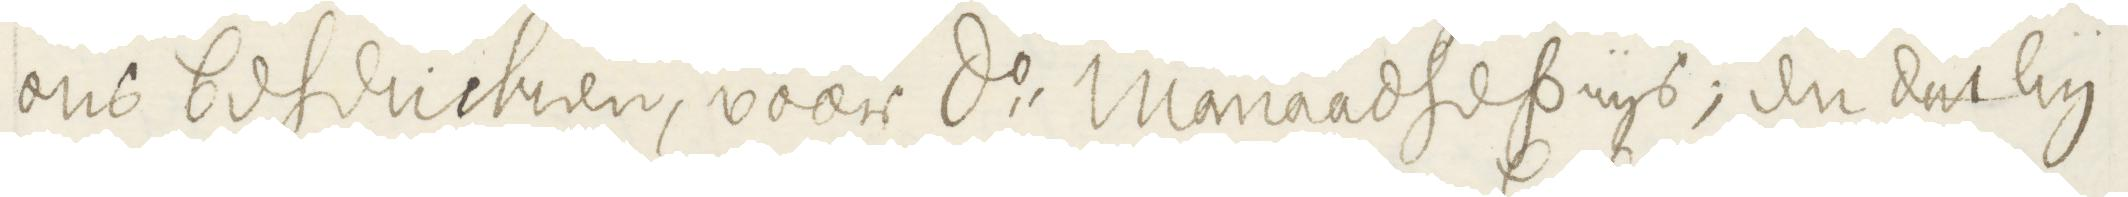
ons beschicken, voor d„o Manaadse prijs; en dat hij
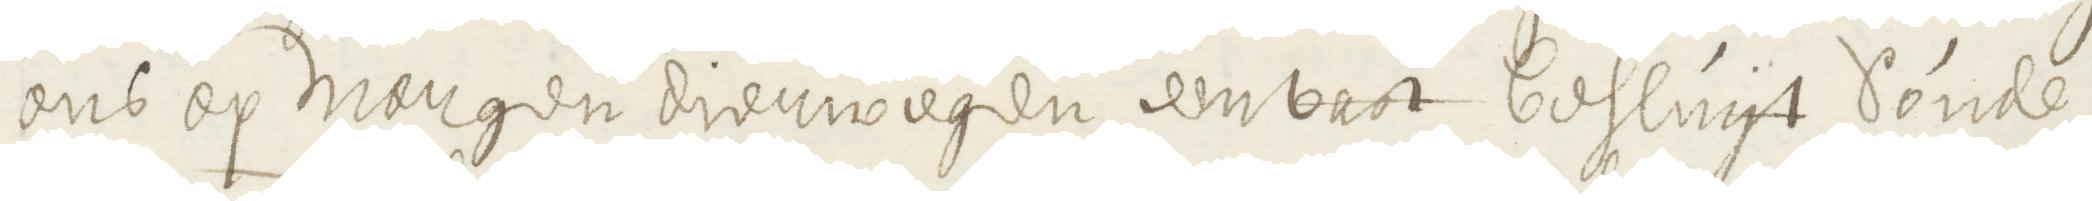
ons op morgen dierwegen een vast besluijt Soude
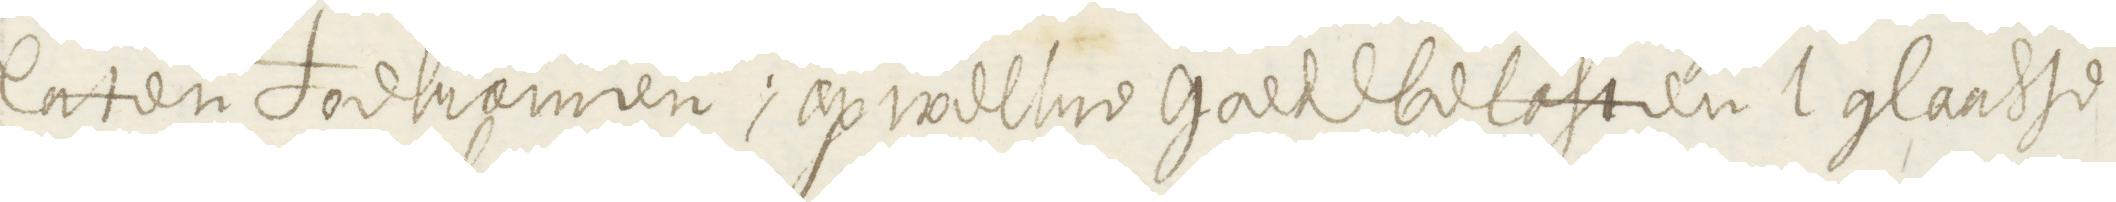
laten toekomen; op welke goede beloften 1 glaasje
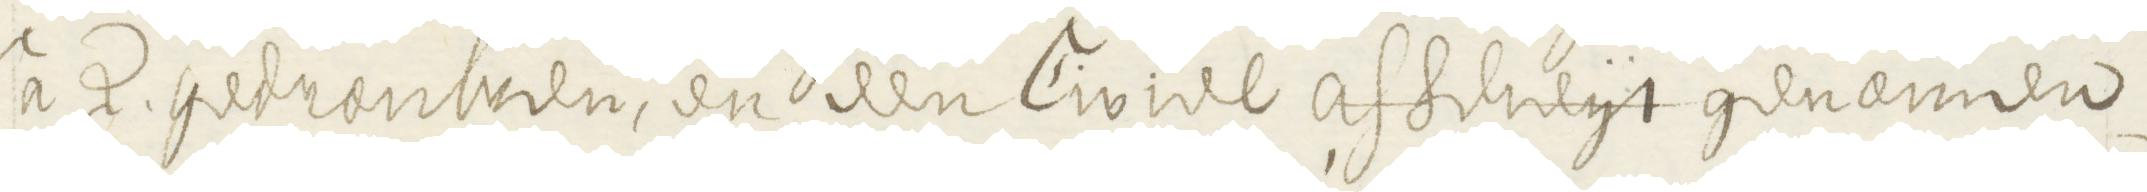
â 2. gedronken, en een Civiel afscheijt genomen
